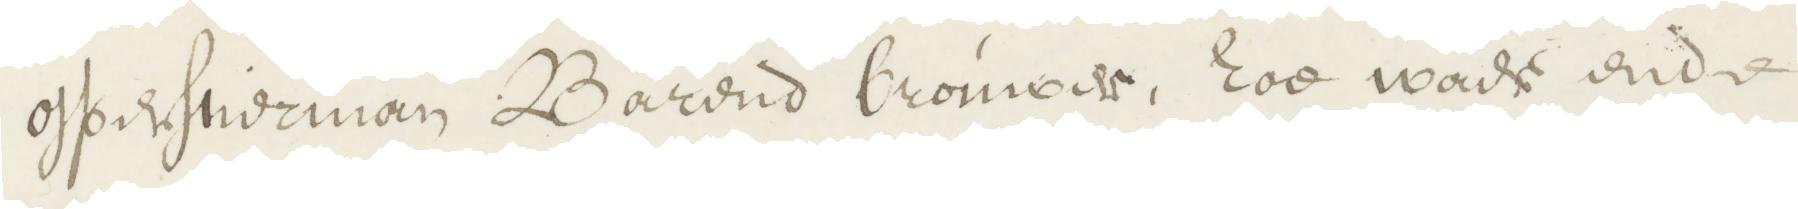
opperstierman Barend brouwer, hoe waer ende
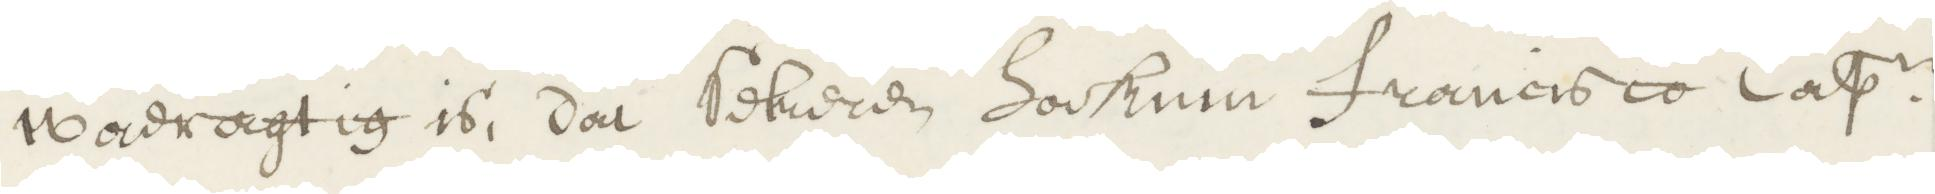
waeragtig is, dat sekeren hoekum francisco Cap.
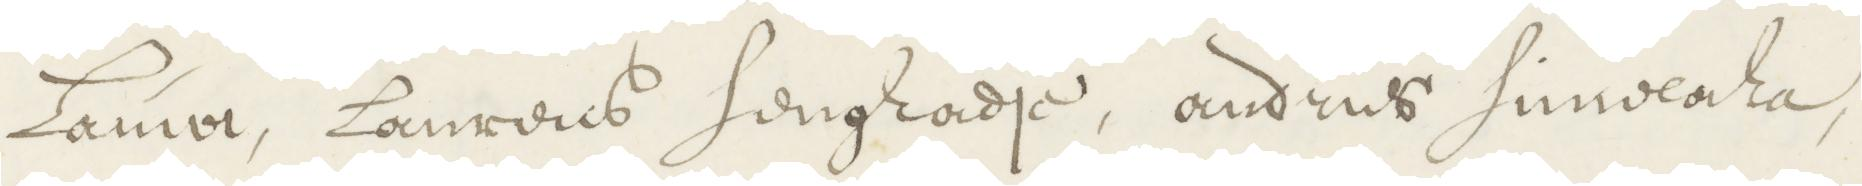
Lauwt, Laurens senghadje, andries simelaha,
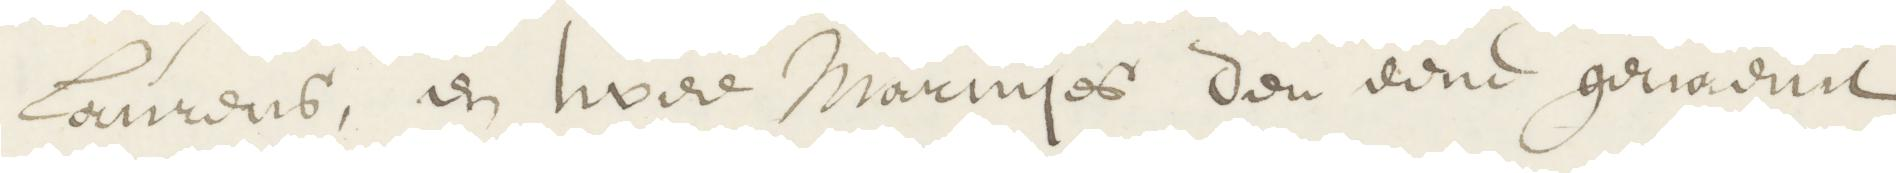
Laurens, en twee Marinjes den eene genaemt
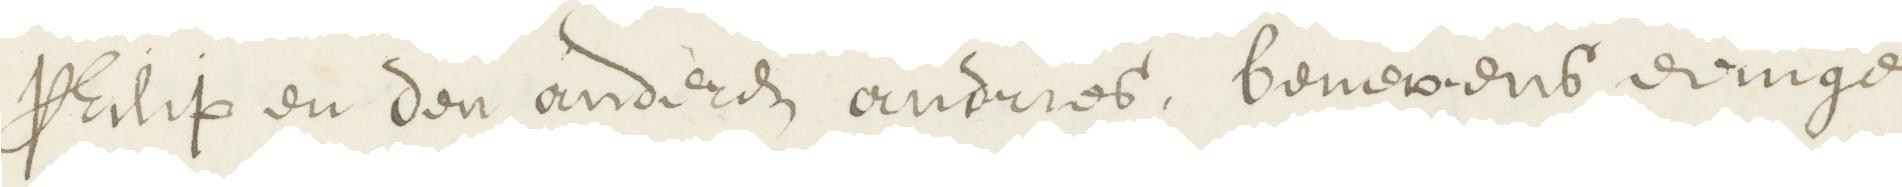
Philip en den anderen andries, benevens eenige
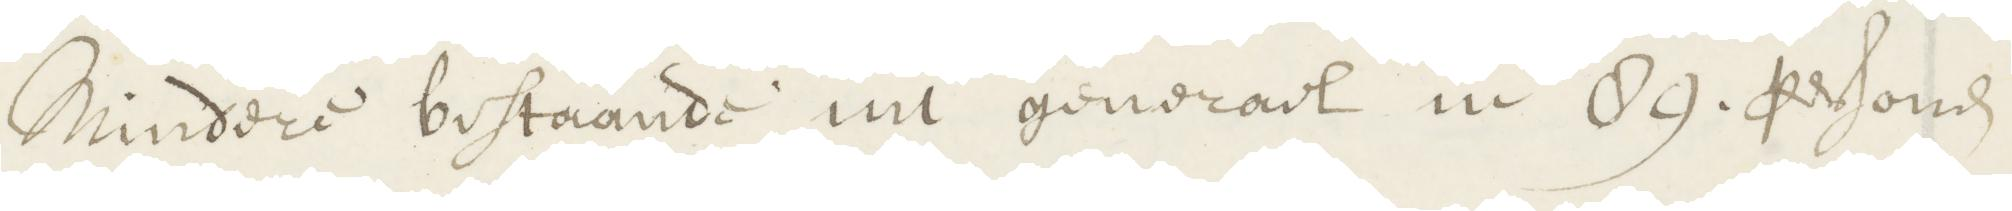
Mindere bestaande in't generael in 89. personen
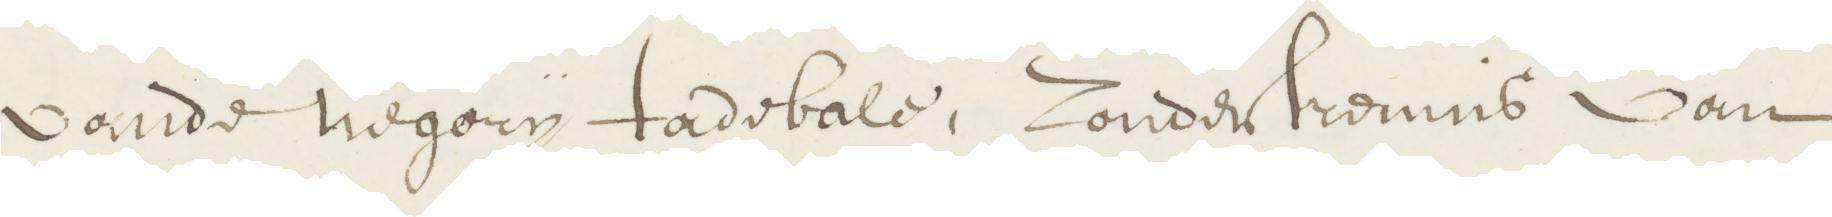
vande negorij tadebale, zonder kennis van
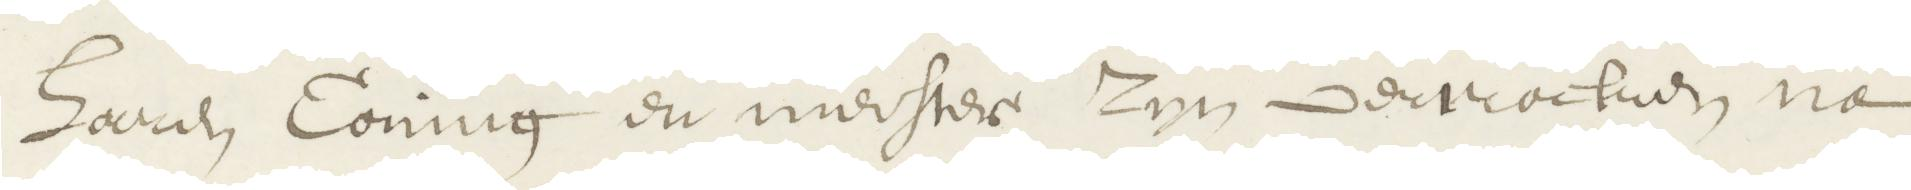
haren Coning en meester zijn vertrocken na
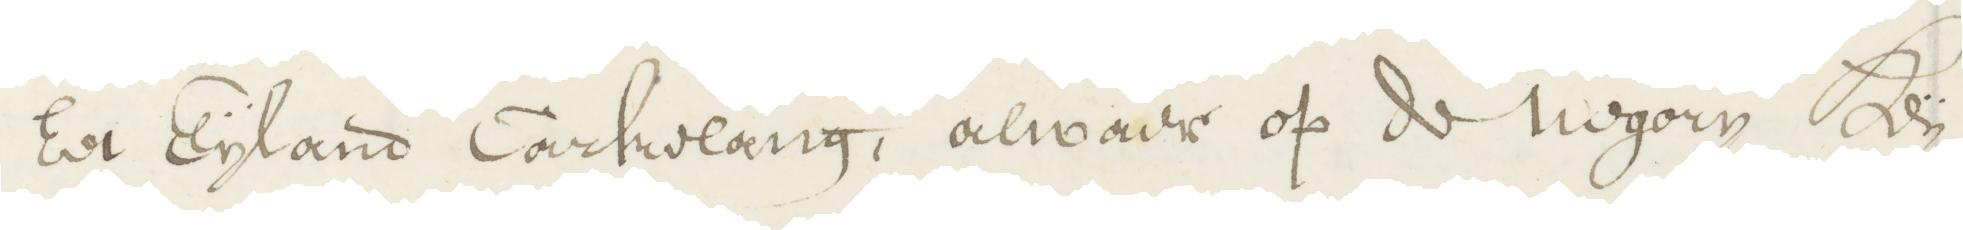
het Eijland Carkelang, alwaer op de negorij Heij
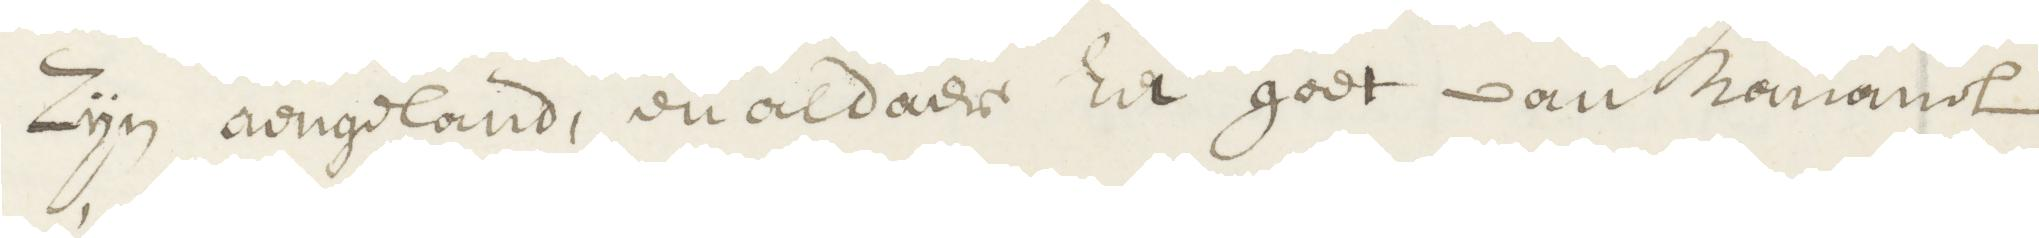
zijn aengeland, en aldaer het goet van Mananel
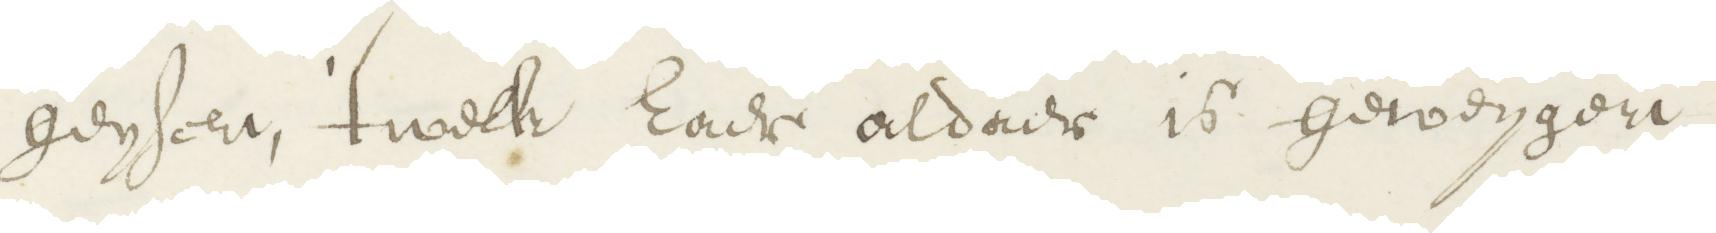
g'eyscht, 'twelk haer aldaer is geweijgert
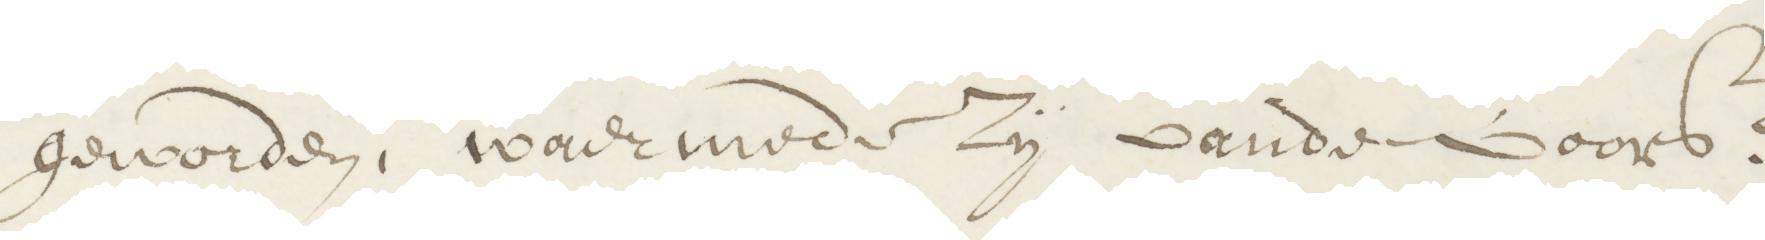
geworden, waer mede zij vande voors.z
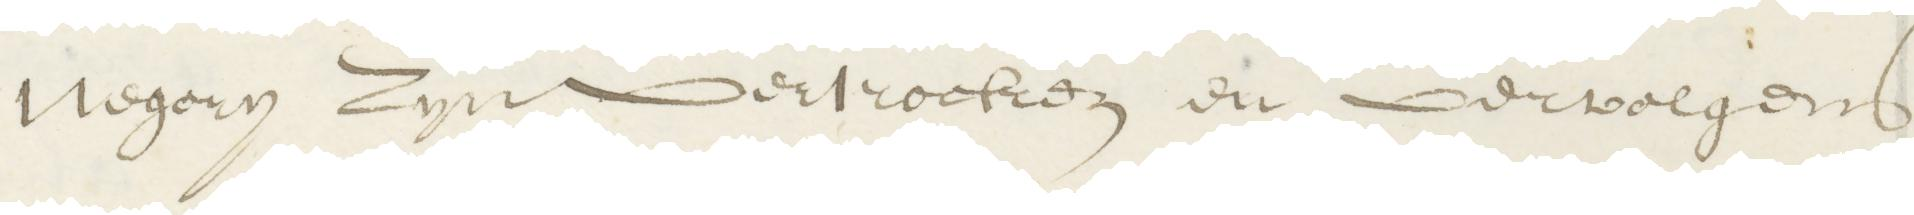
negory zijn vertrocken en vervolgens
